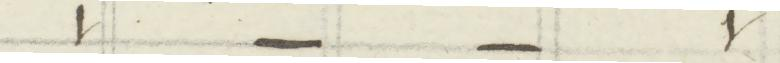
1 — — 1
